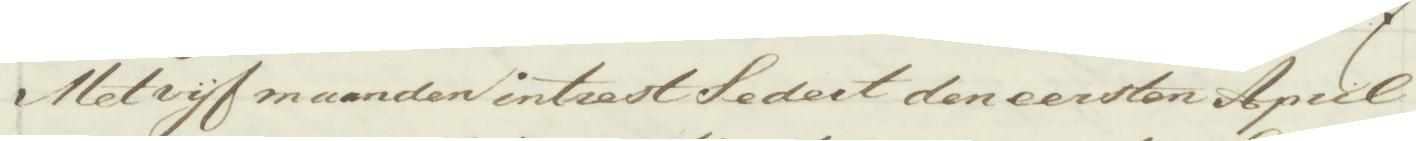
Met vijf maanden intrest Sedert den eersten April
